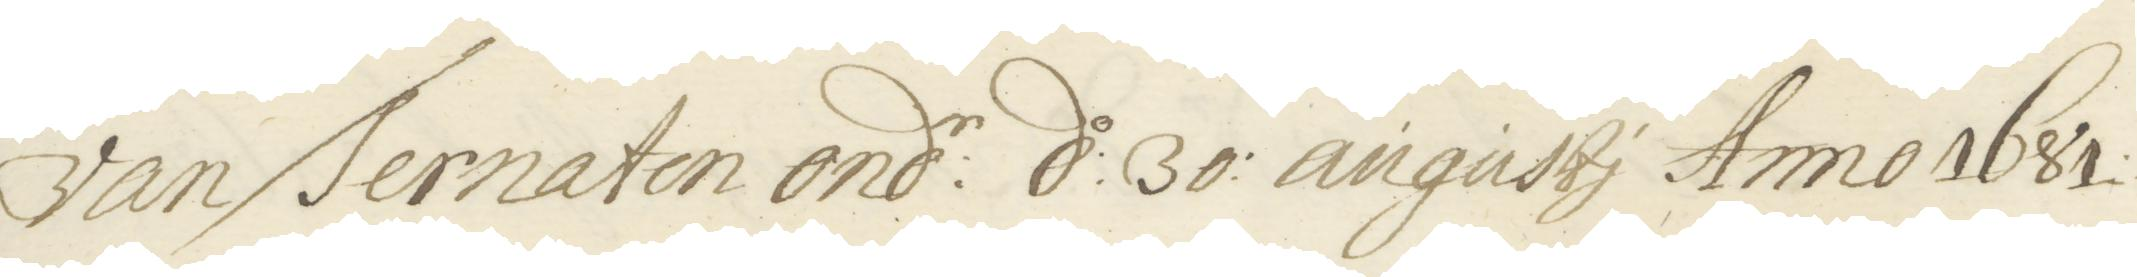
Van Ternaten ond:r d:o 30: augustj Anno 1681:
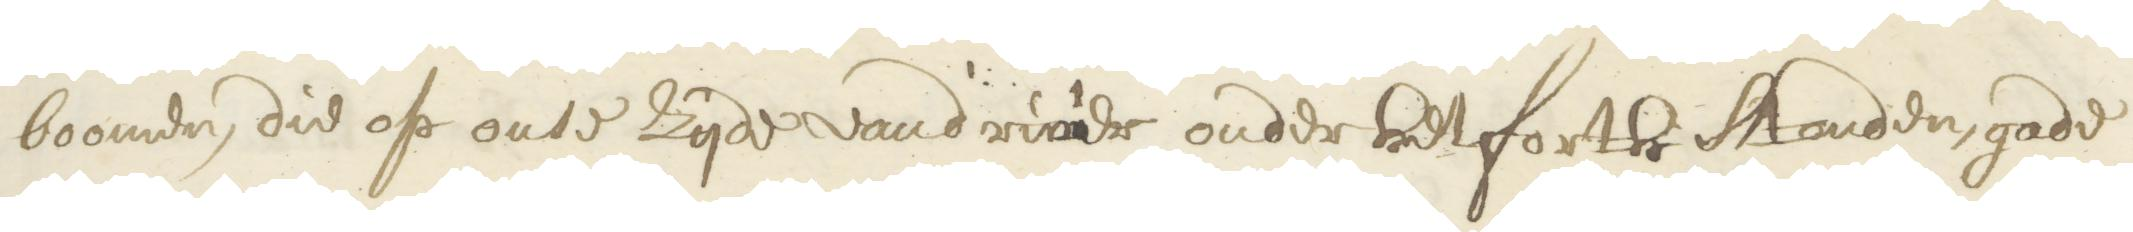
boomen, die op onse zijde van d’ rivier onder het forth stonden, gade
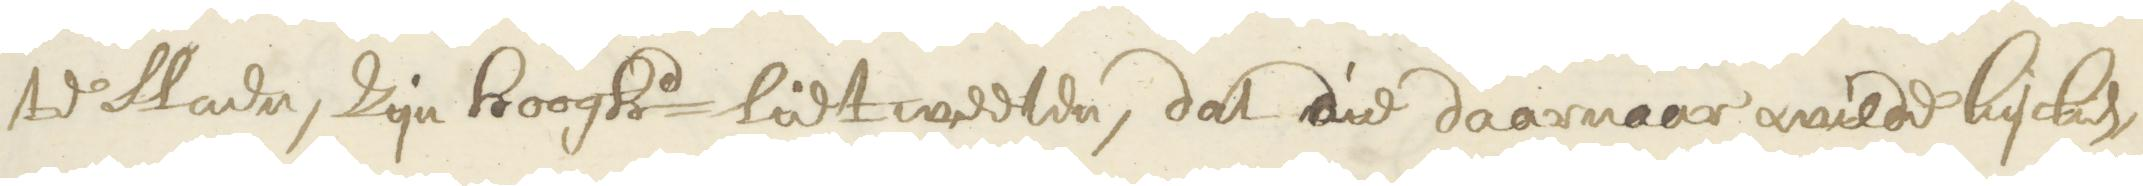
te slaen, zijn hoogh=d liet weeten, dat die daarnaar wilde kijcken,
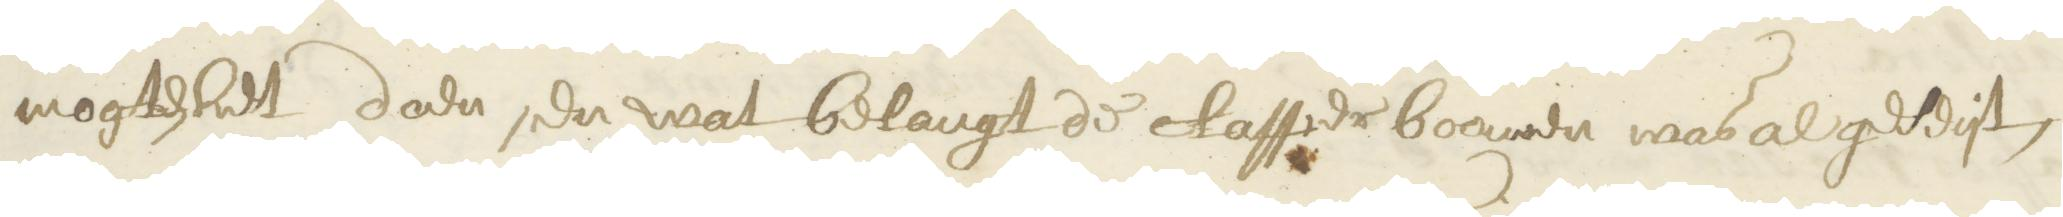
mogte het doen, en wat belangt de clapper boomen was al geseijt,
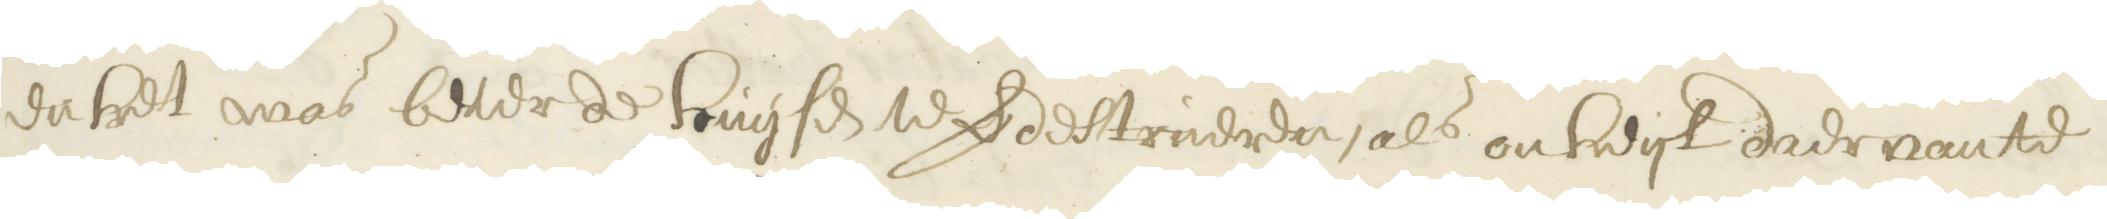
en het was beter de huijsen te verdestrueren, als onheijl daer van te
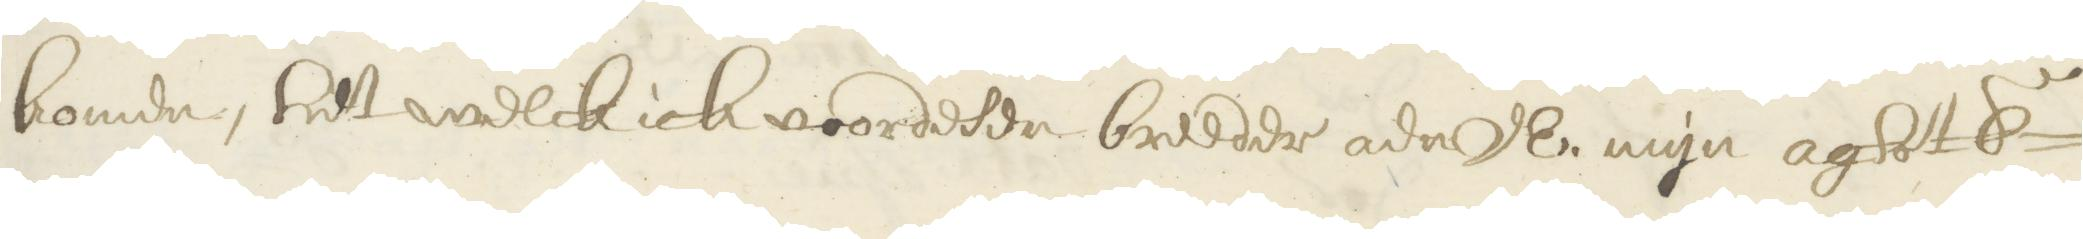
komen, het welck ick voor desen breeder aen VE. mijn aghtb=e
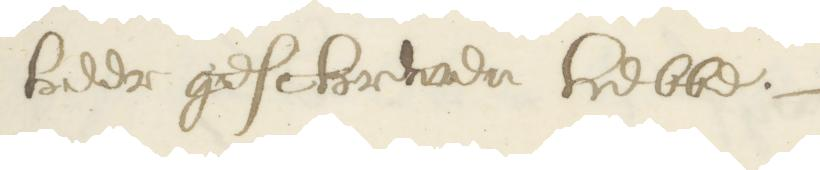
heer geschreven hebbe.-
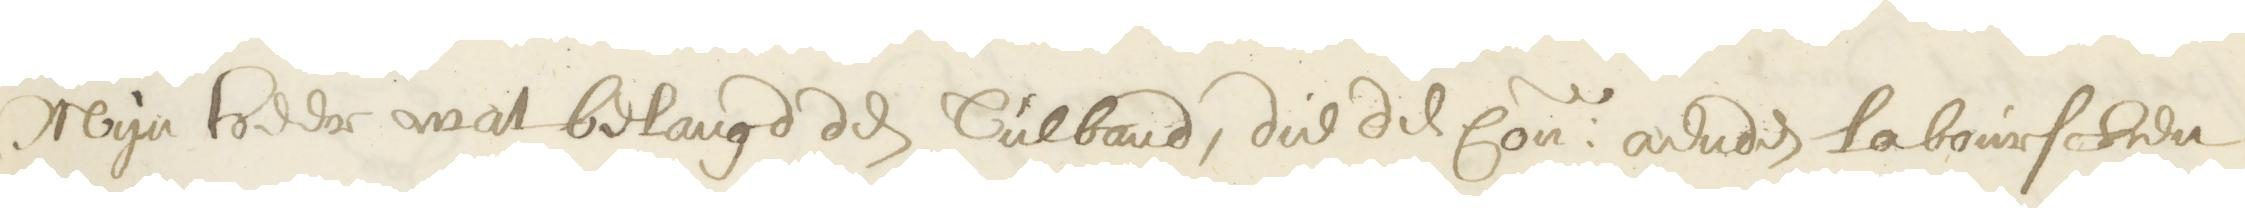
Mijn heer wat belangd den Tulband, die de Con:' aenden labourschen
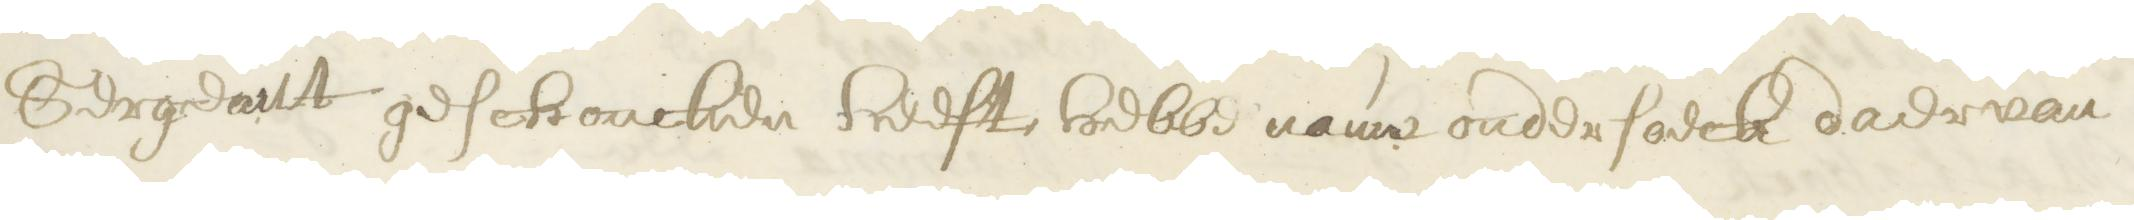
Sergeant geschoncken heeft, hebbe nauw ondersoeck daer van
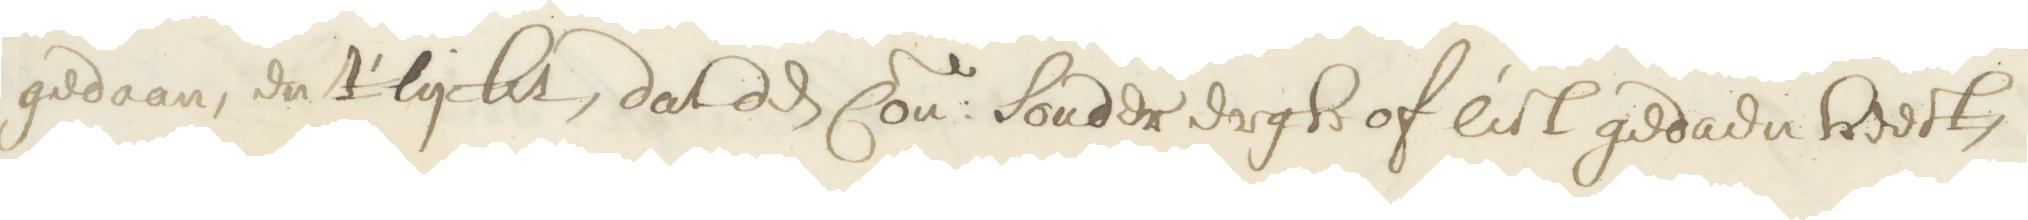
gedaan, en t' lijckt, dat den Con:' sonder ergh of list gedaen heeft,
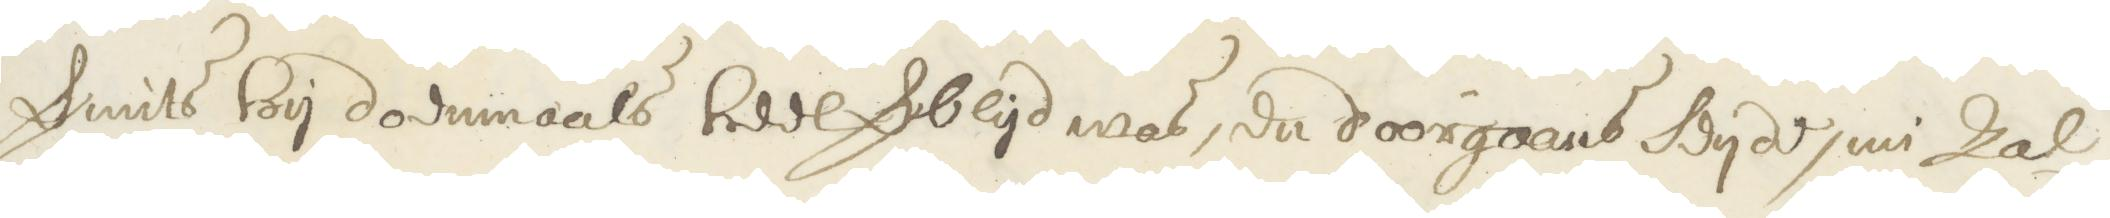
vermits hij doenmaals heel verblijd was, en doorgaans seijde, nu zal
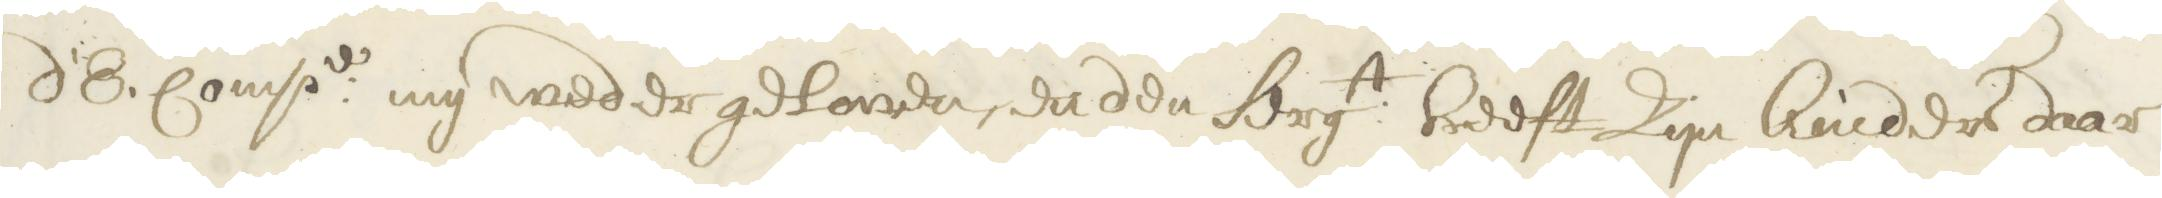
d' E. Comp:e mij weder geloven, en den serg:t heeft zijn kinders daar
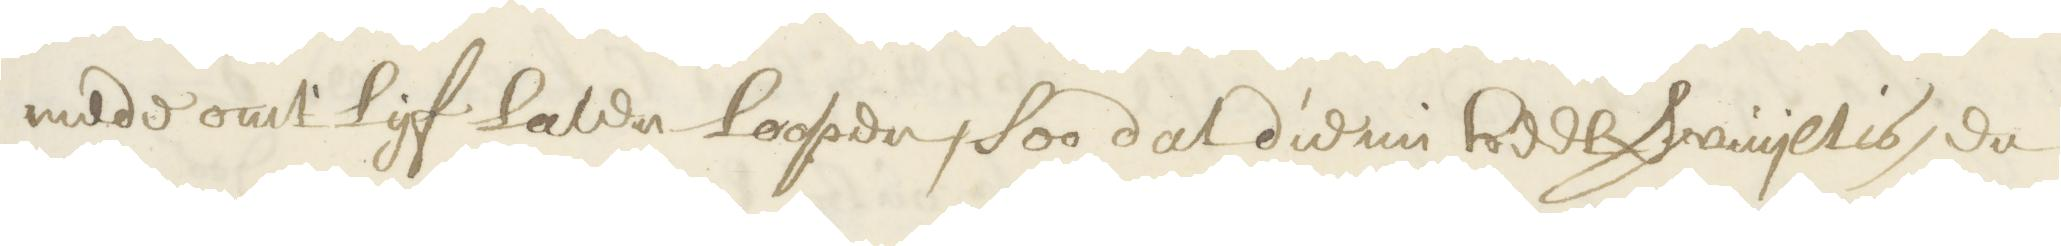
mede omt' lijf laten loopen, soo dat die nu heel vervuijlt is, en
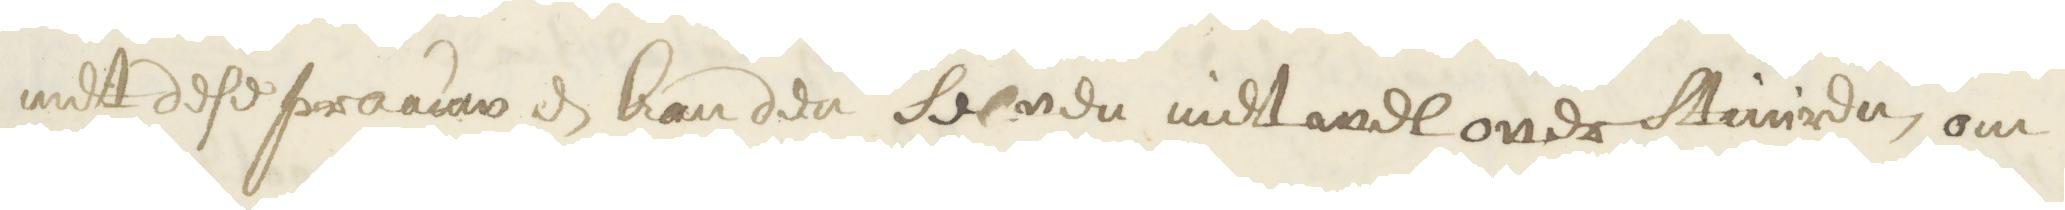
met dese praauw en kan den selven niet wel over stuuren, om
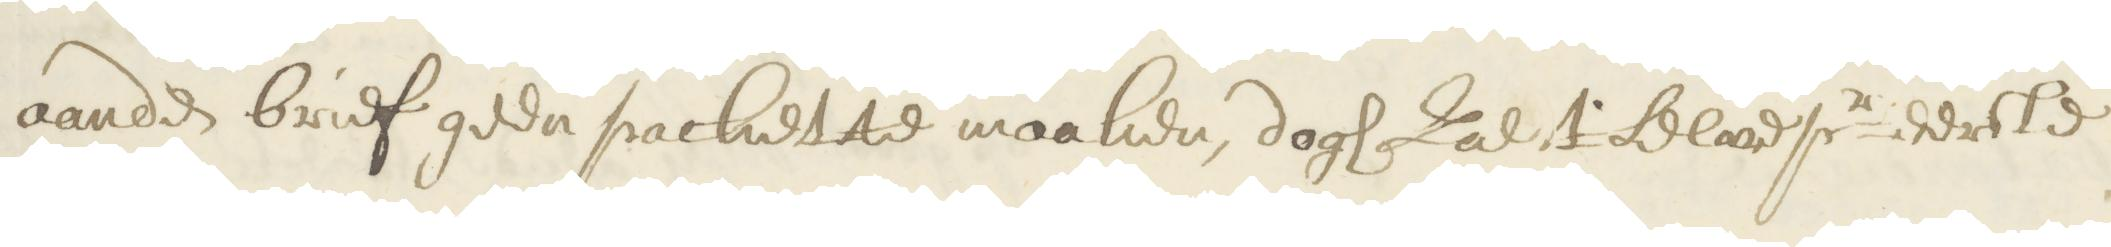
aanden brief geen packet te maaken, dogh zal t' selve p=r eerste
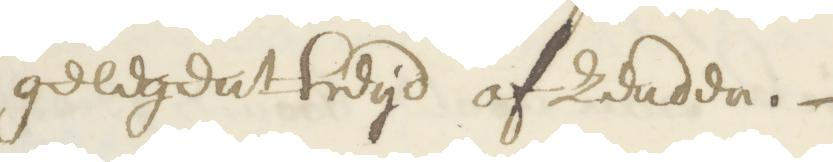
gelegentheijd afzenden.-
